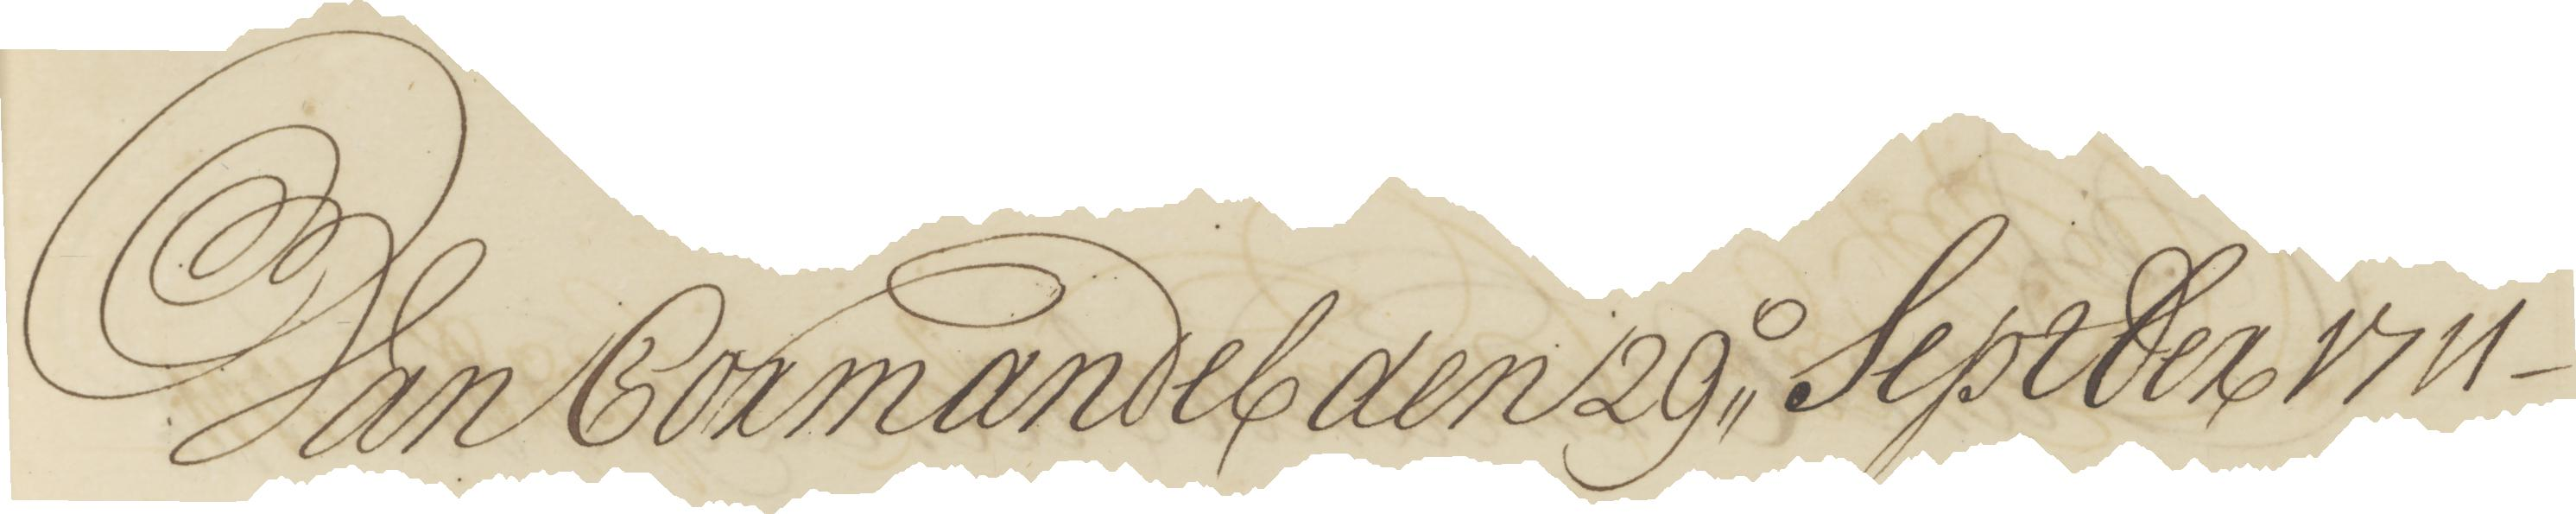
Van Cormandel den 29„o Septber 1711—
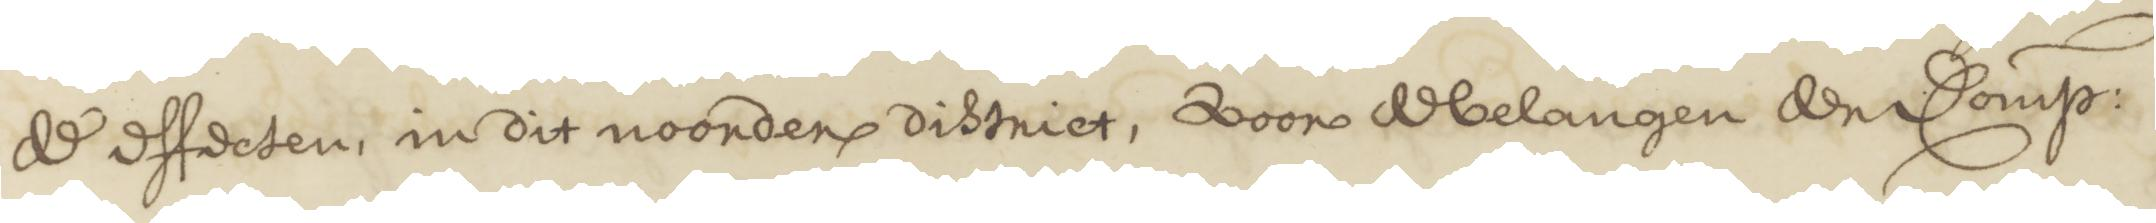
de effecten, in dit noorder district, voor de belangen der EComp:
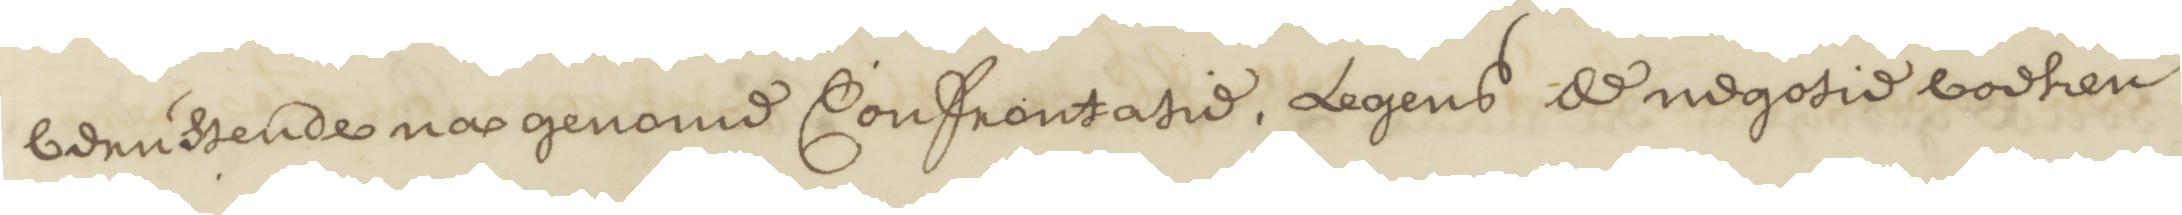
berustende na genome Confrontatie, tegens de negotie boeken
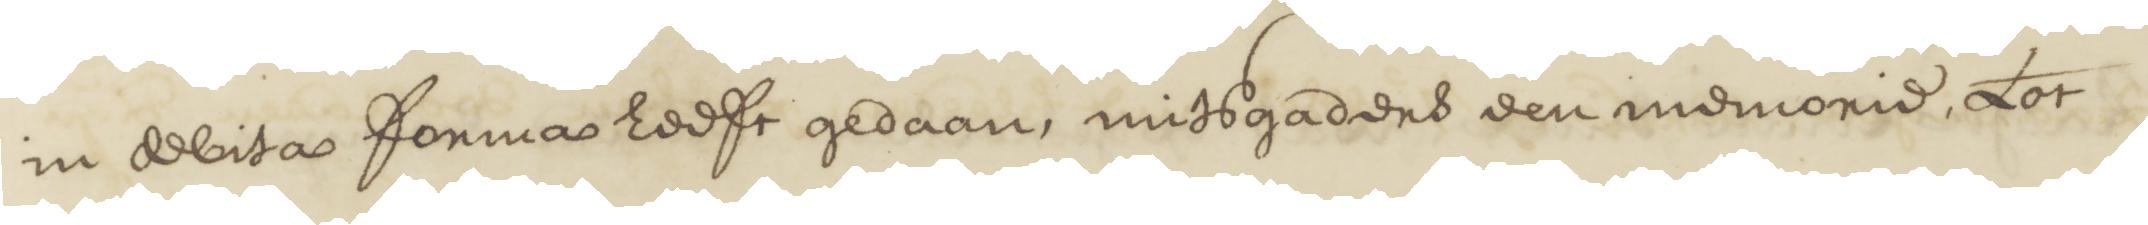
in debita forma heeft gedaan, mitsgaders een memorie, tot
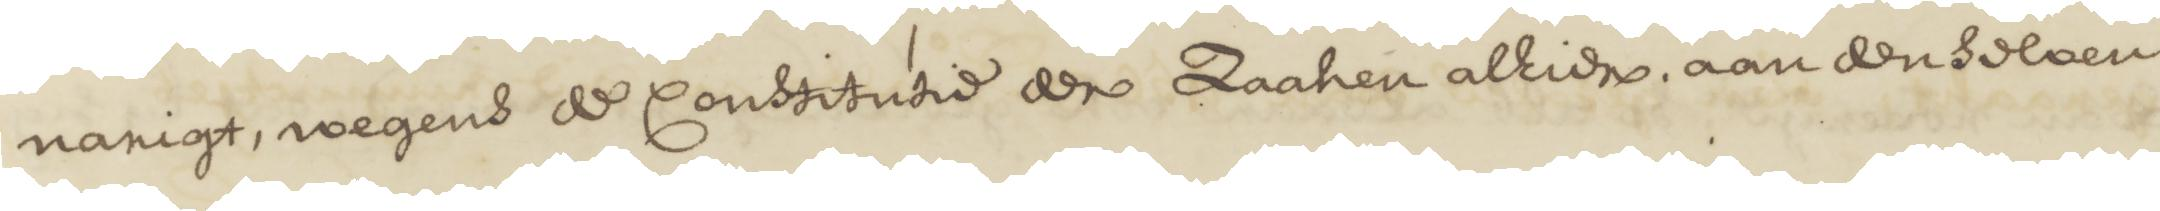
narigt, wegens de Constitutie der Zaaken alhier, aan den selven
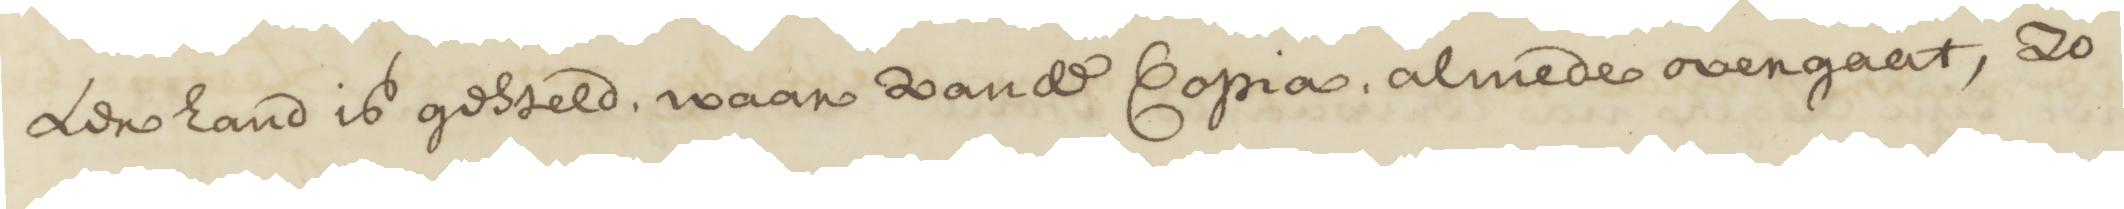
ter hand is gesteld, waar van de Copia, almede overgaat, Zo
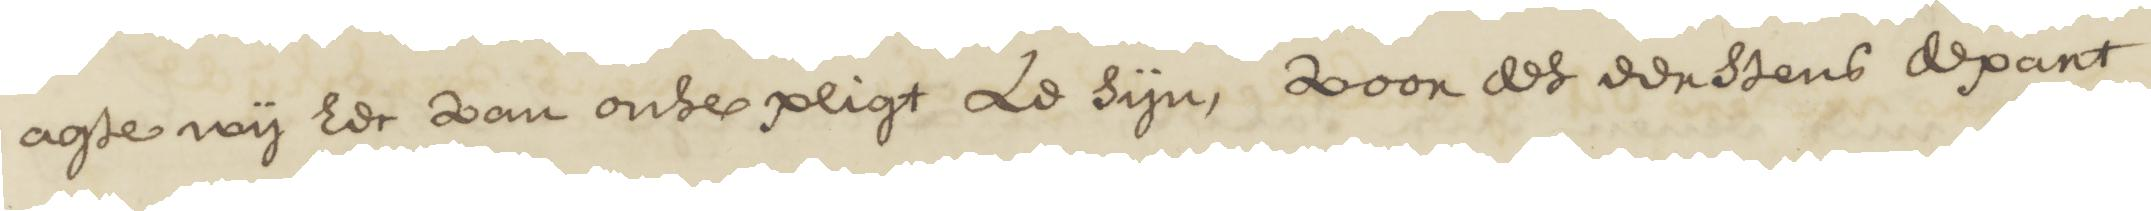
agte wij het van onse pligt te sijn, voor des eerstens depart
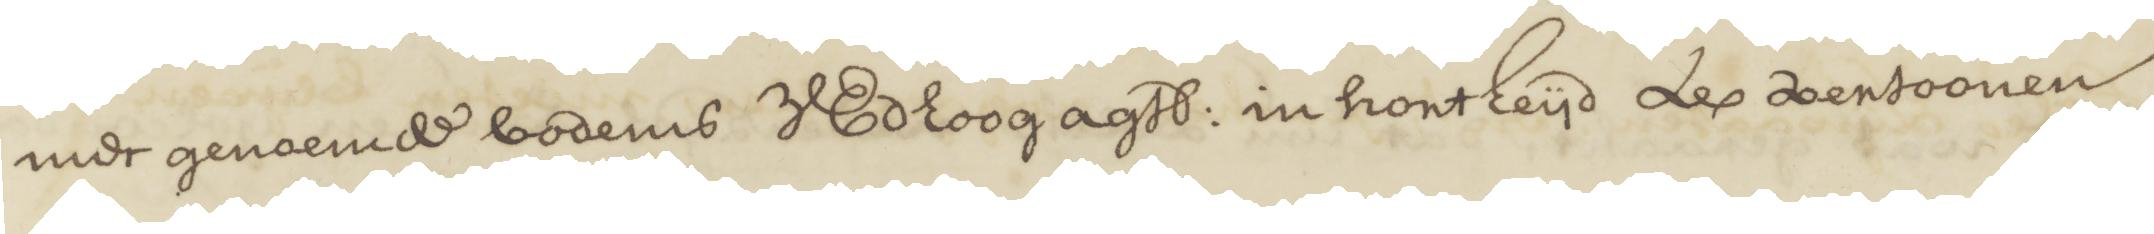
met genoemde bodems VEd hoog agtb: in kortheijd te vertoonen
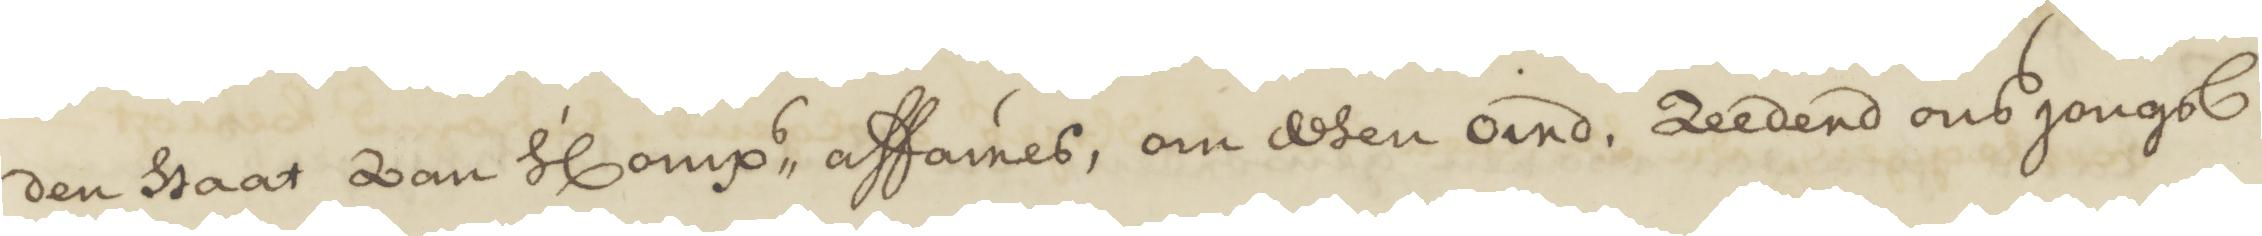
den staat van s'Comp„s affaires, om desen oird, zeederd ons jongst
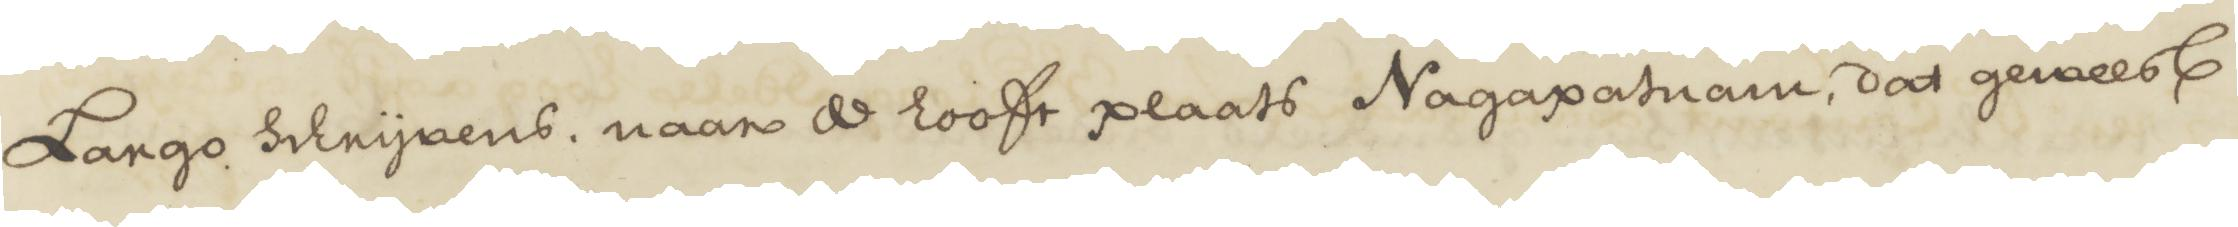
Largo schrijvens, naar de hooft plaats Nagapatnam, dat geweest
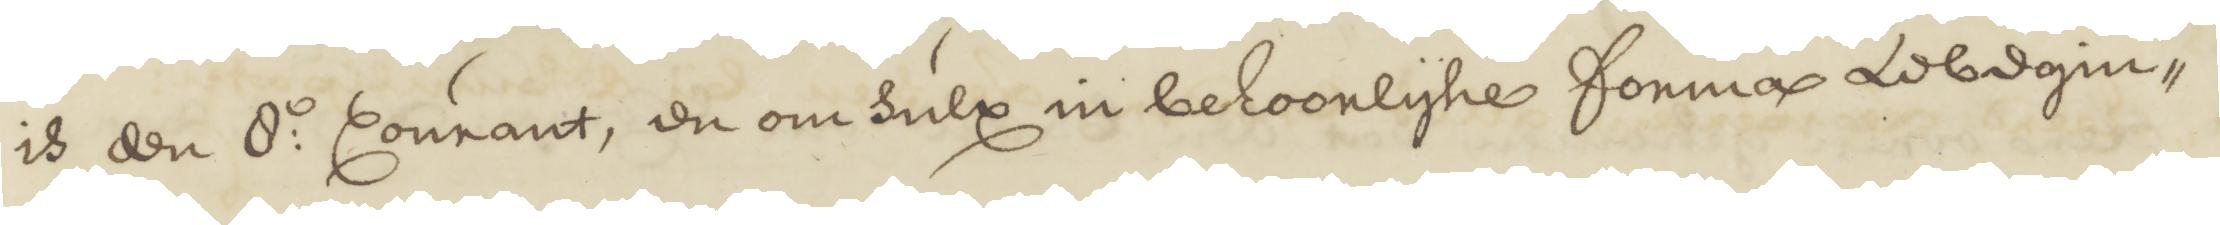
is den 8:' Courant, en om sulx in behoorlijke forma te begin„
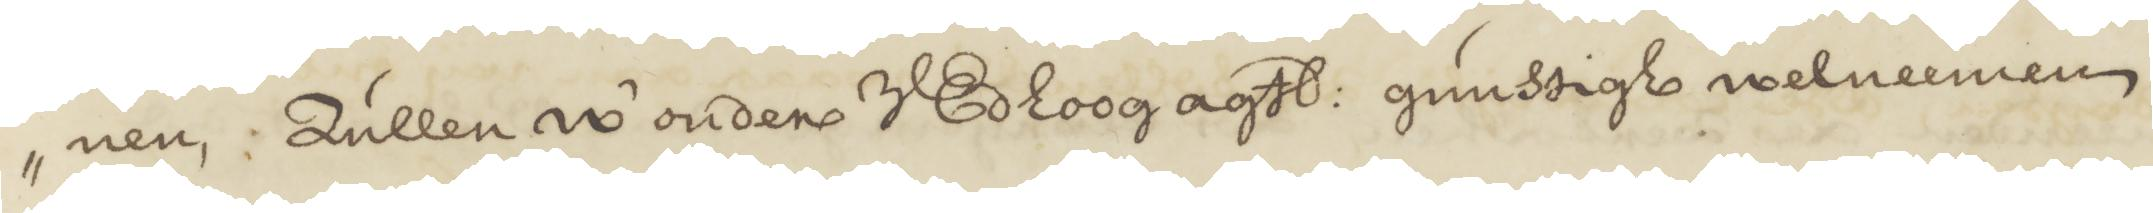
„nen, Zullen w' onder V Ed hoog agtb: gunstigh wel neemen
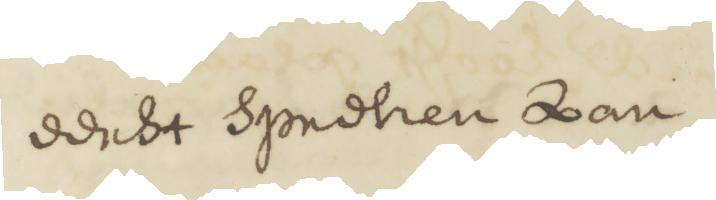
eerst spreken van
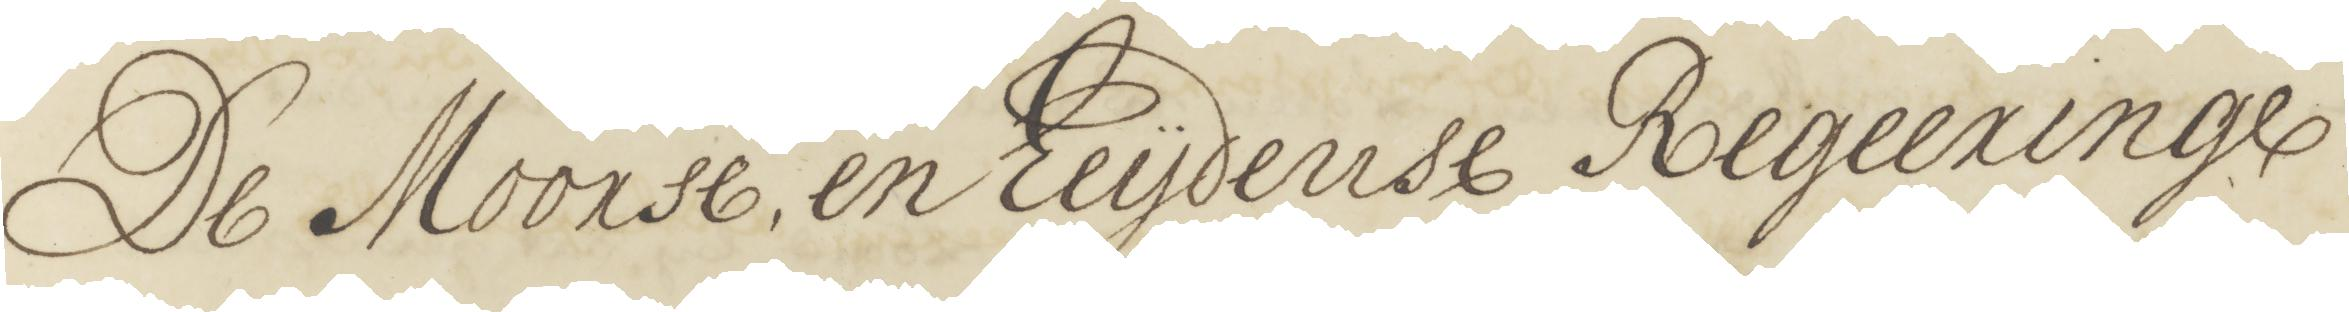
De Moorse, en heijdense Regeeringe
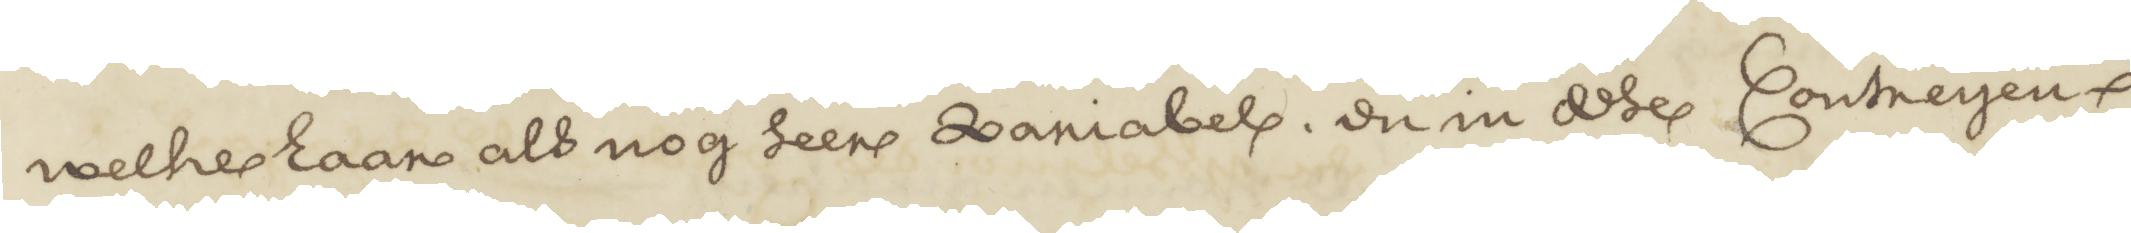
welke haar als nog seer variabel, en in dese Contreijen
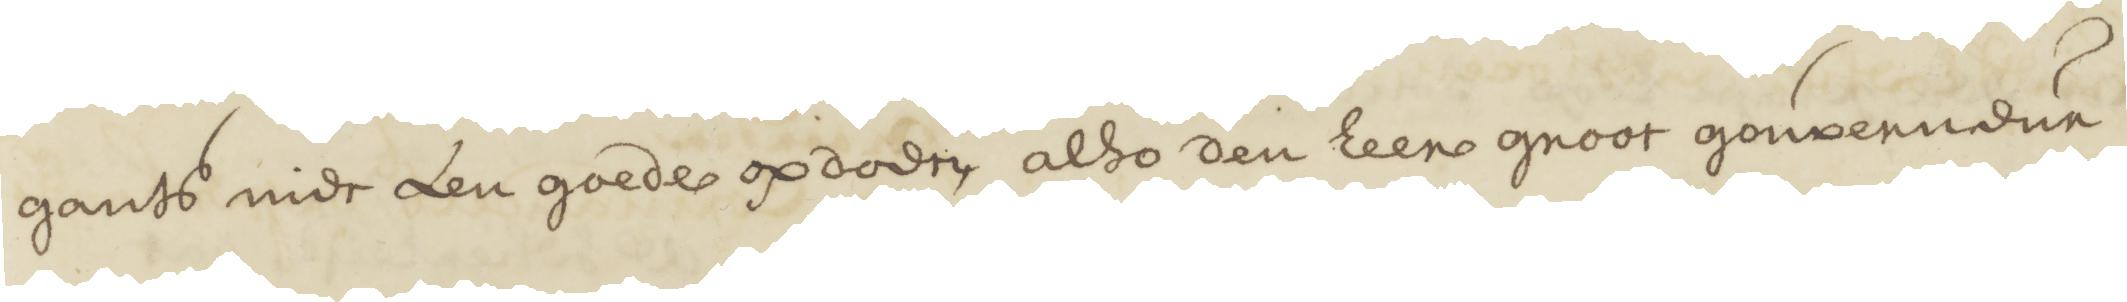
gants niet ten goede op doet also den heer groot gouverneur
